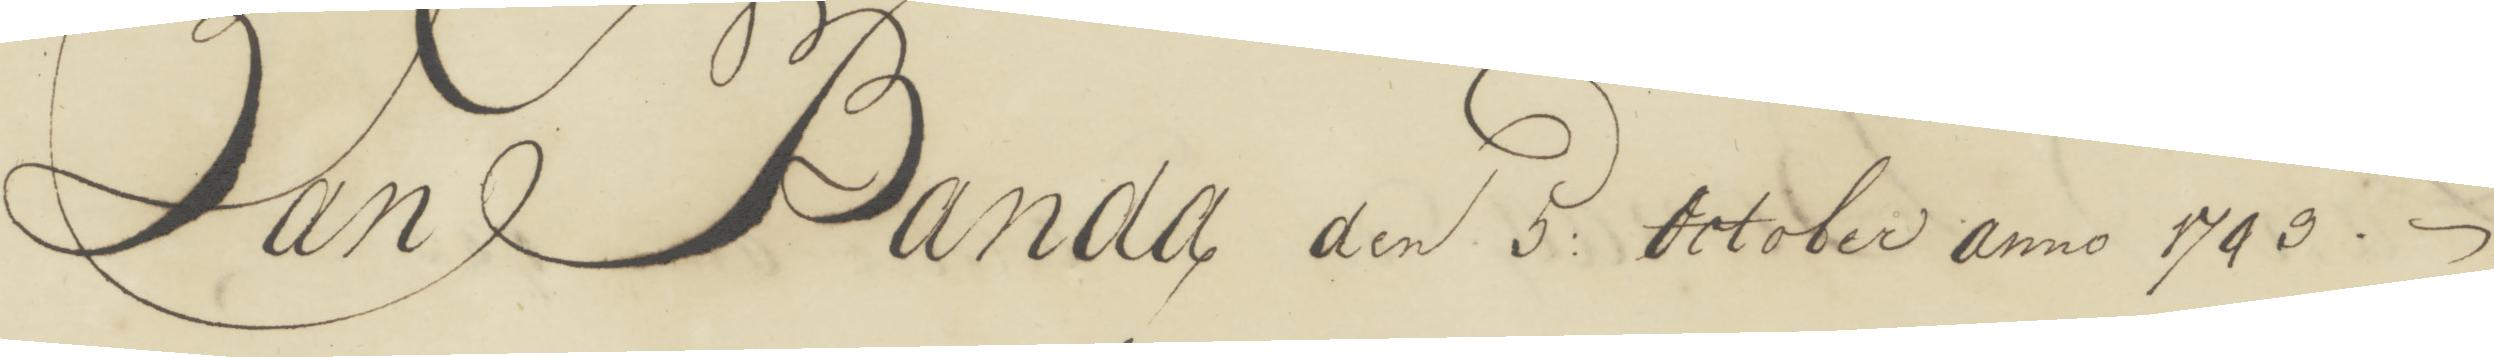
Van Banda den 5: October anno 1743. —
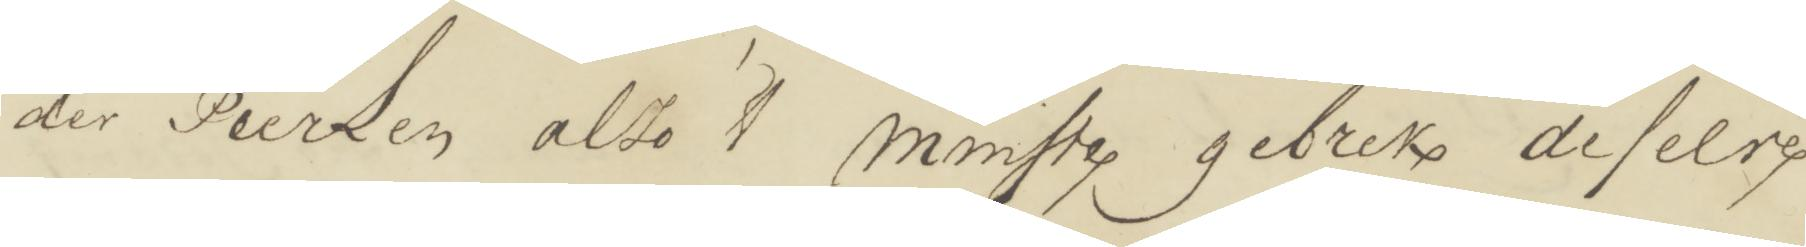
der Peerlen alzo ’t minste gebrek deselve
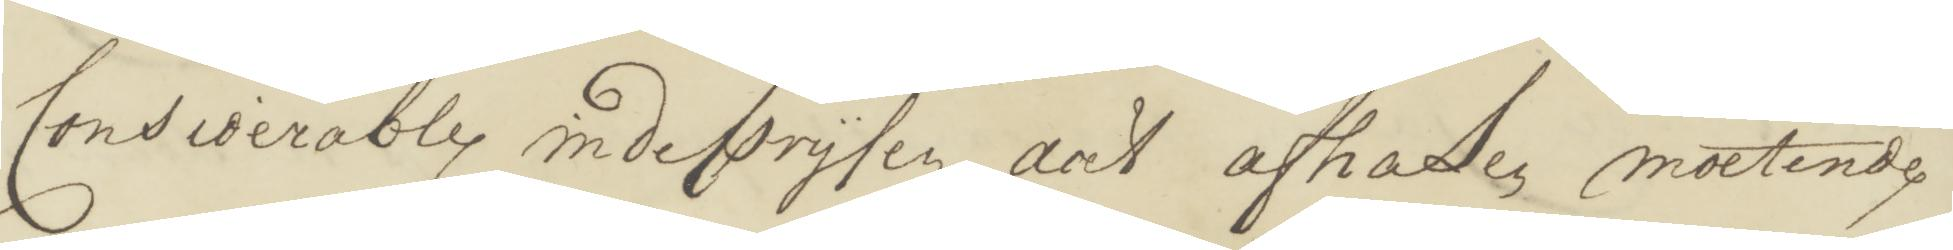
considerable in de prijsen dat afhalen moetende
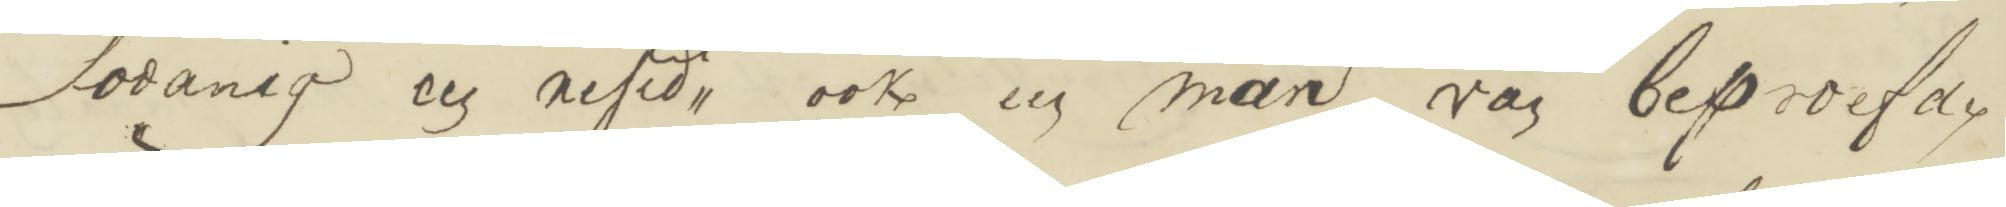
sodanig een resid„t ook een man van beproefde
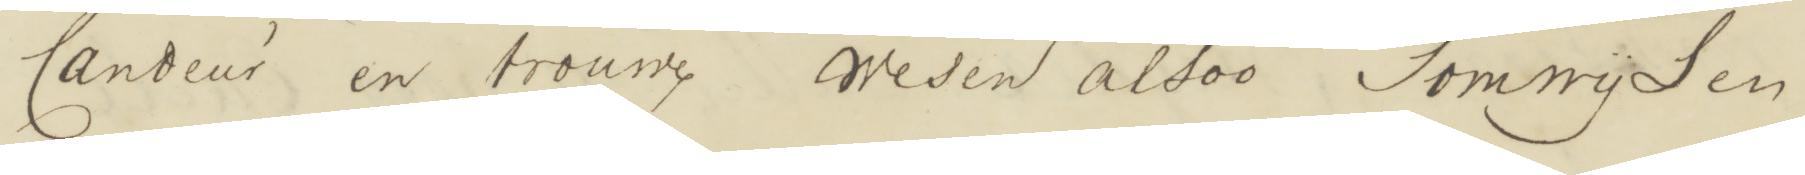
candeur en trouwe wesen alsoo somwijsen
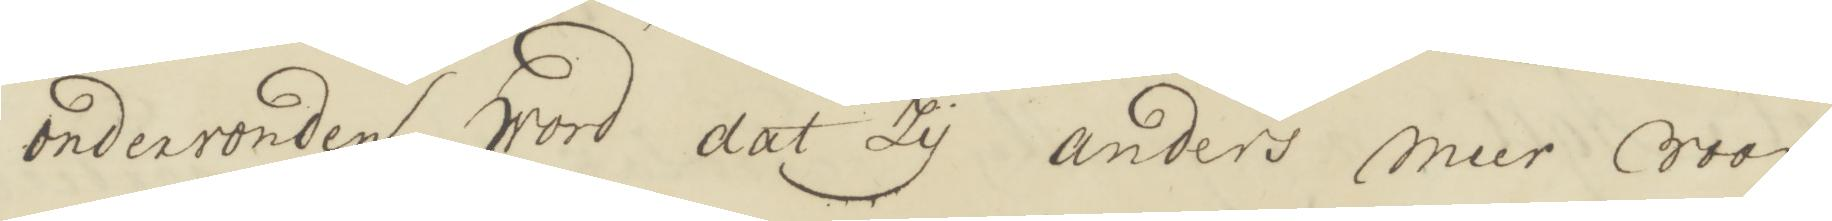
ondervonden word dat zij anders meer voor
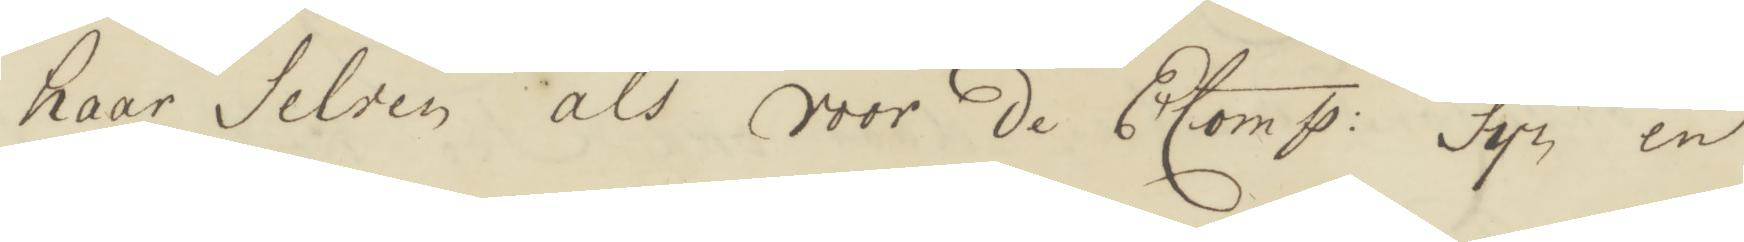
haar selven als voor de E Comp: sijn en
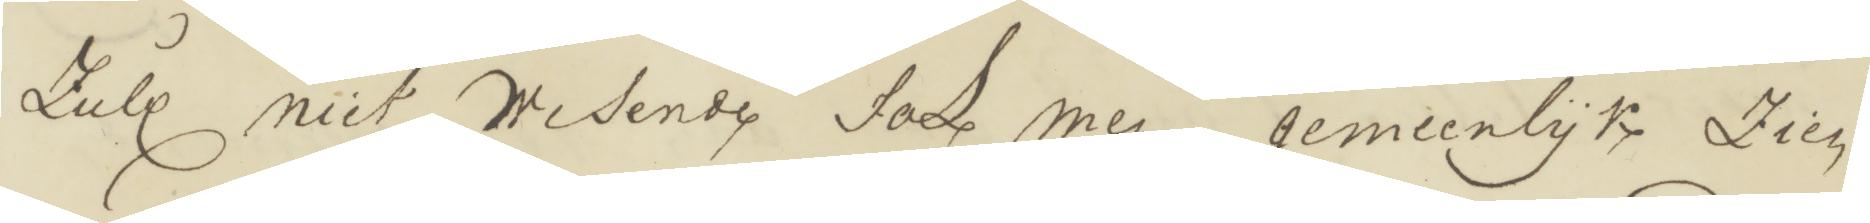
zulx niet wesende sal men gemeenlijk zien
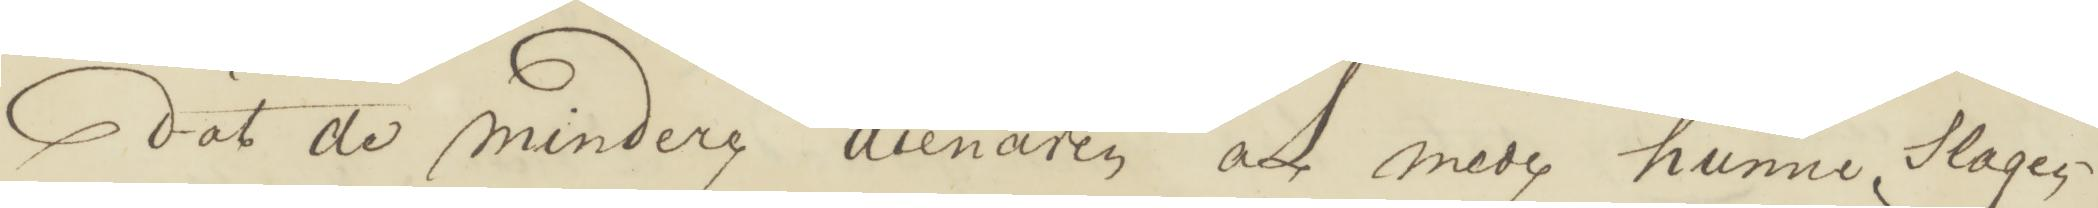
dat de mindere dienaren al mede hunne slagen
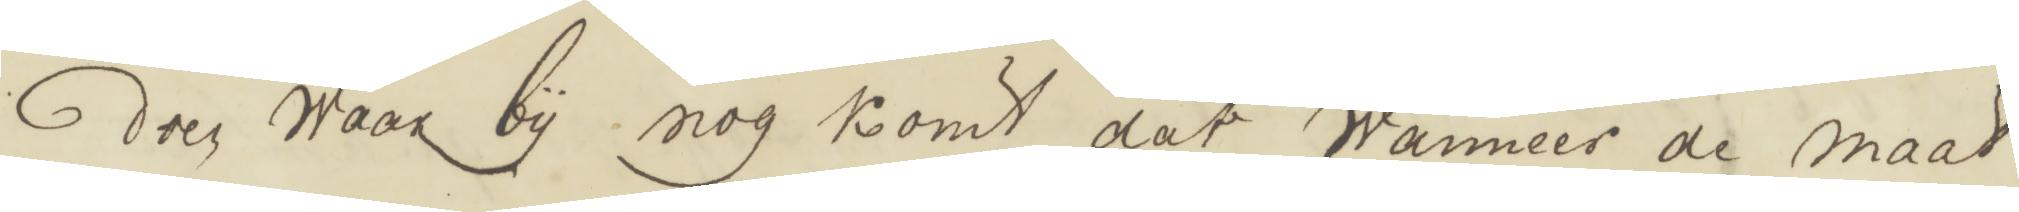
doen waar bij nog komt dat wanneer de maat
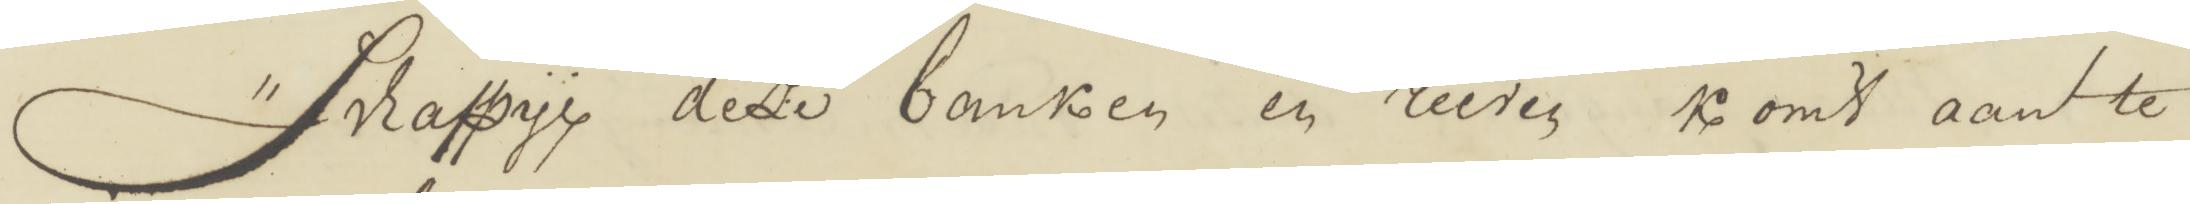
„schappije deze banken en reeven komt aan te
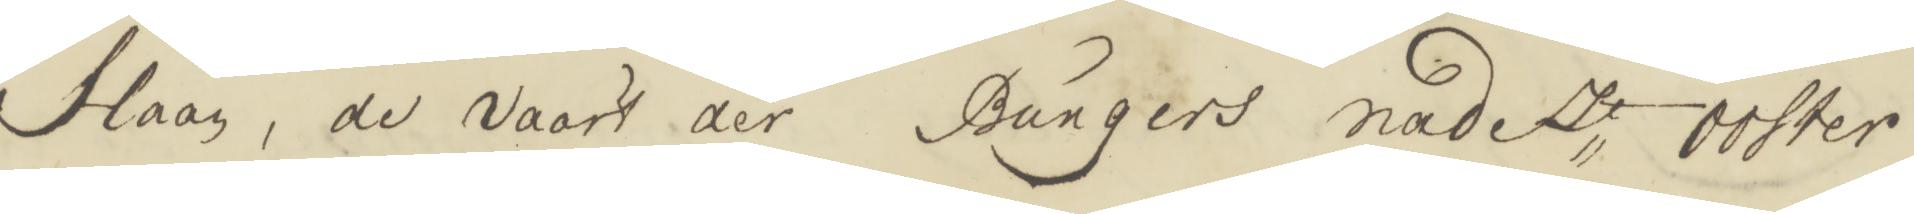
slaan, de vaart der Burgers nadez„t ooster
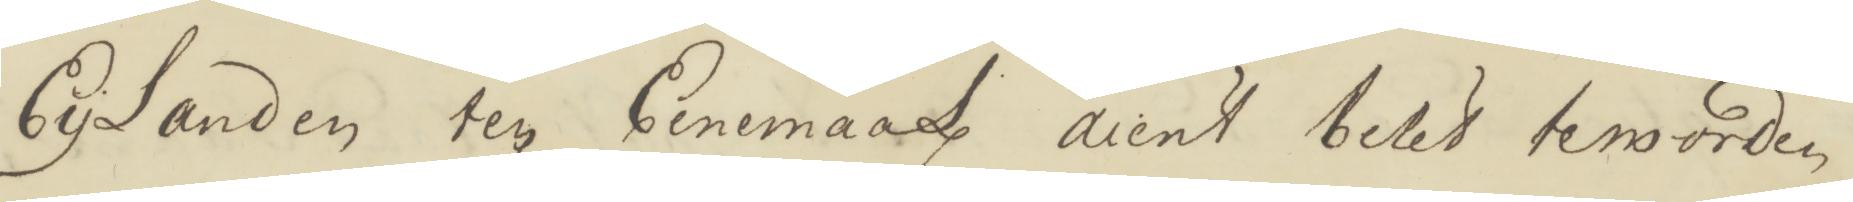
Eijlanden ten Eenemaal dient belet te worden
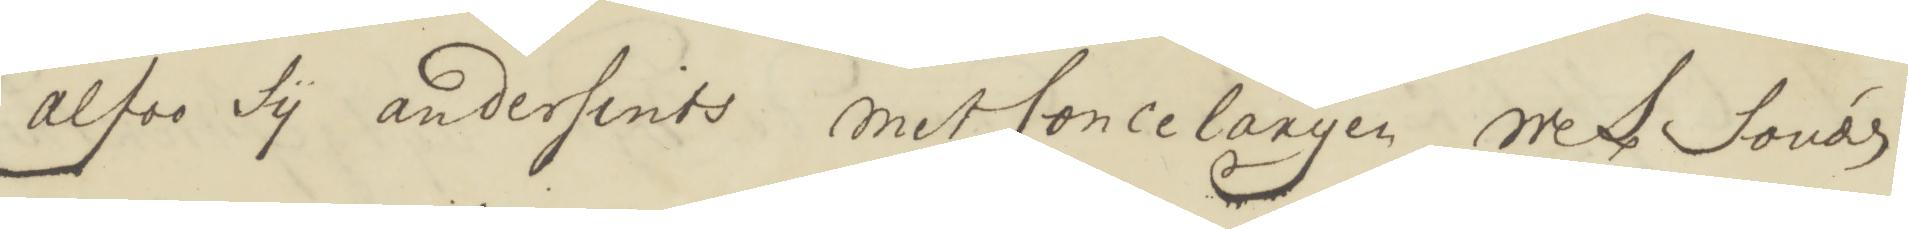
alsoo sij andersints met concelarijen wel soude
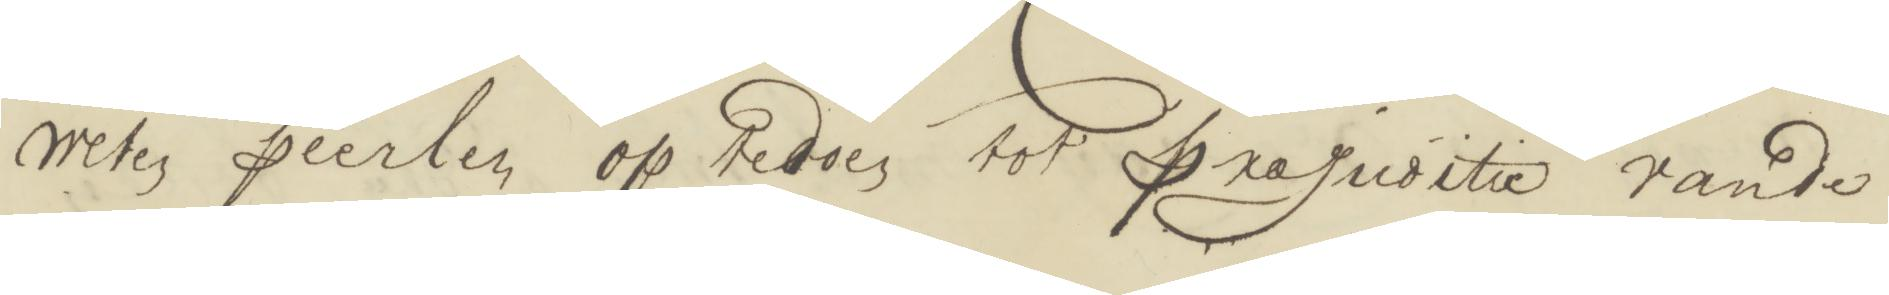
weten peerlen op tedoen tot praejuditie vande
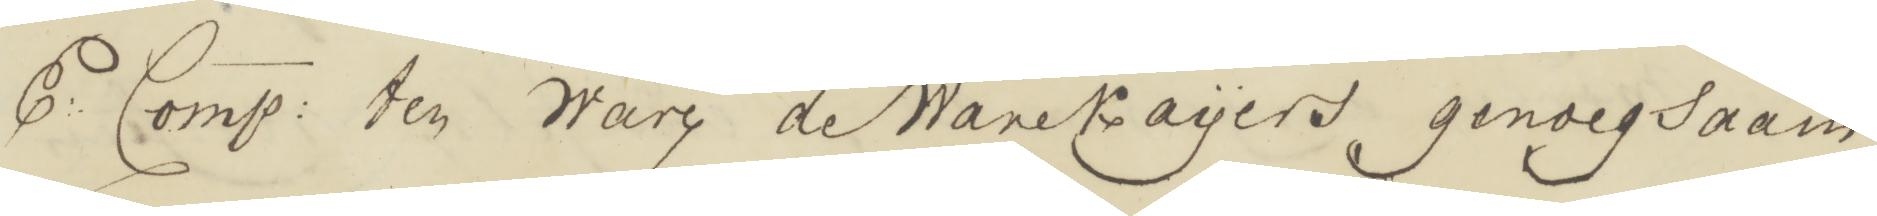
E: Comp: ten ware de Warekaijers genoegsaam
